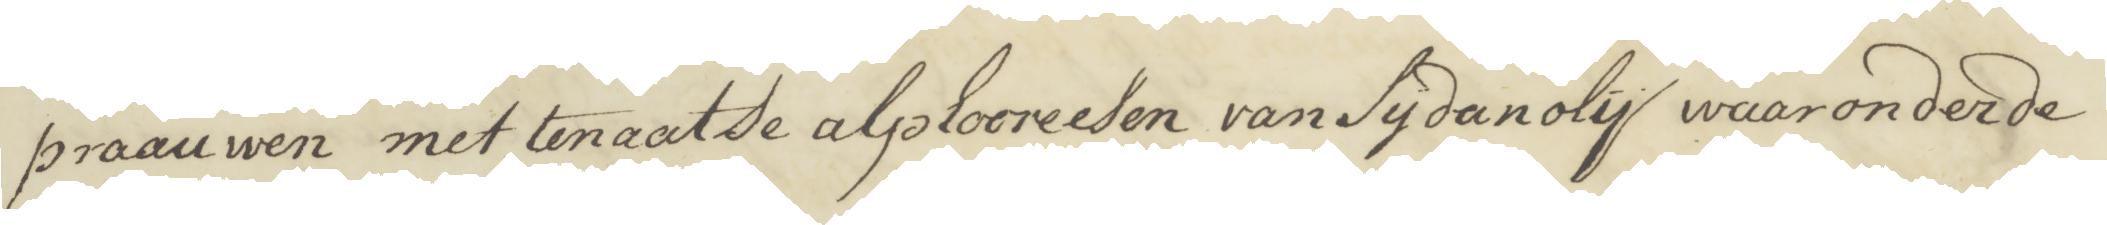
praauwen met tenaatse alphooreesen van sijdanolij waar onder de
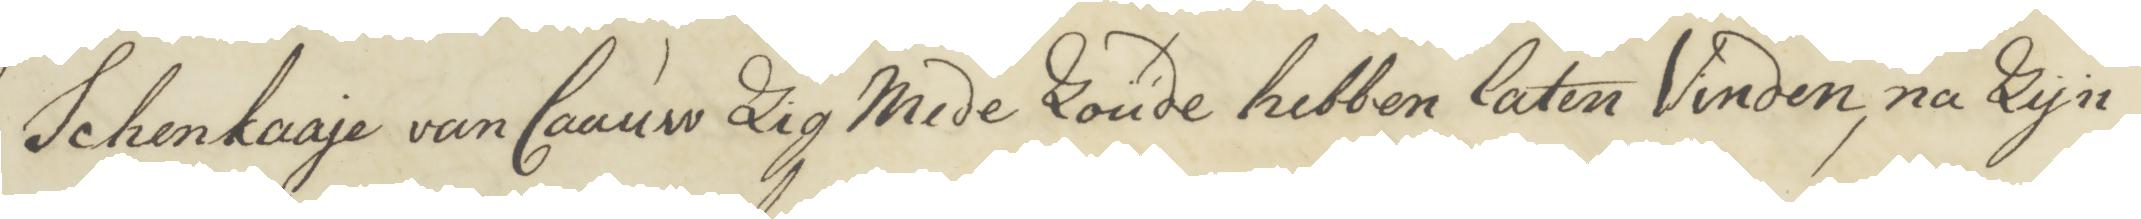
schenkaaje van Caauw zig mede zoude hebben laten vinden, na zijn
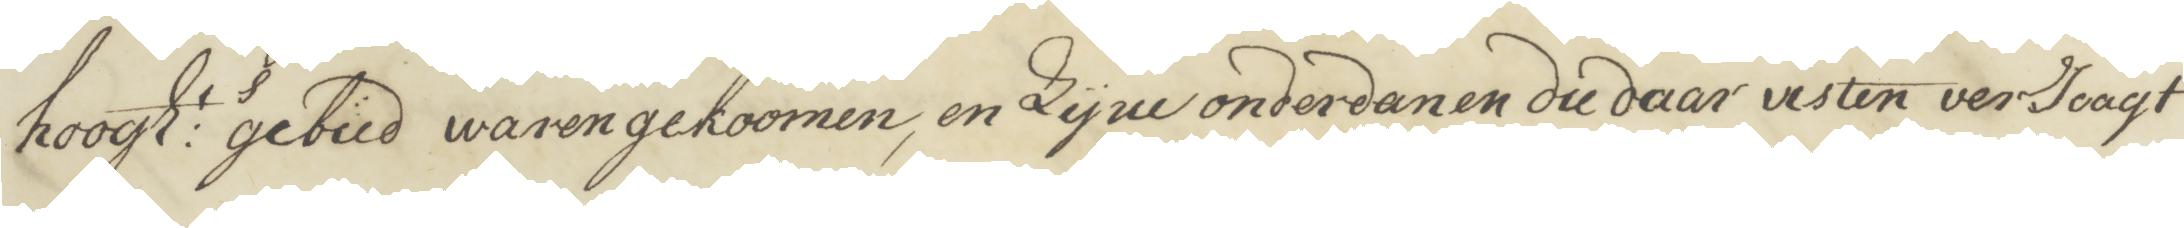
hoogh:ts gebied warengekoomen, en zijne onderdanen die daar visten verIaagt
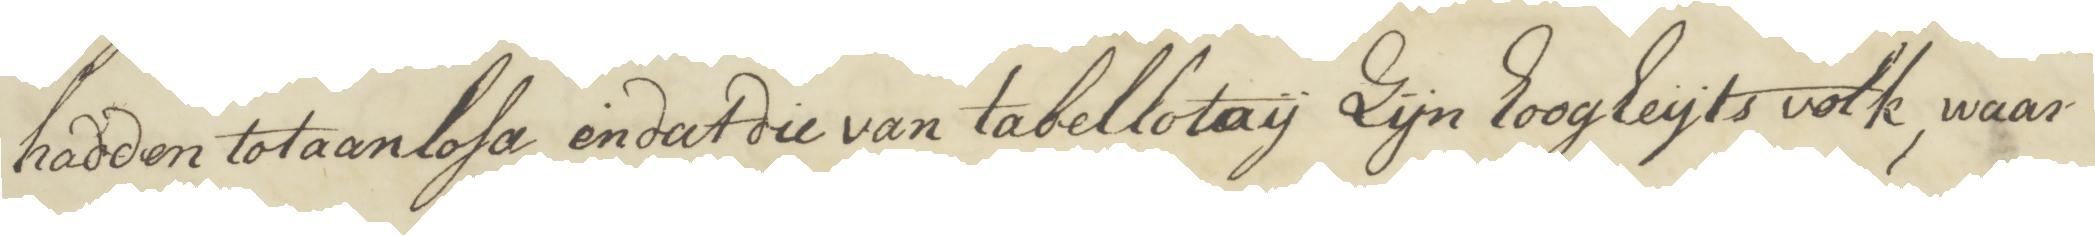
hadden tot aanlosa, en dat die van tabellotaij zijn hoogheijts volk, waar
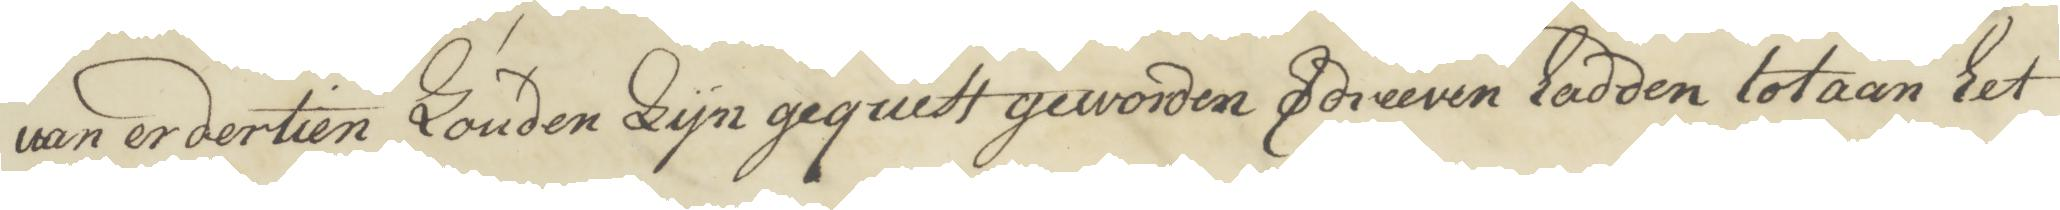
van er dertien zouden zijn gequest geworden verdreeven hadden tot aan het
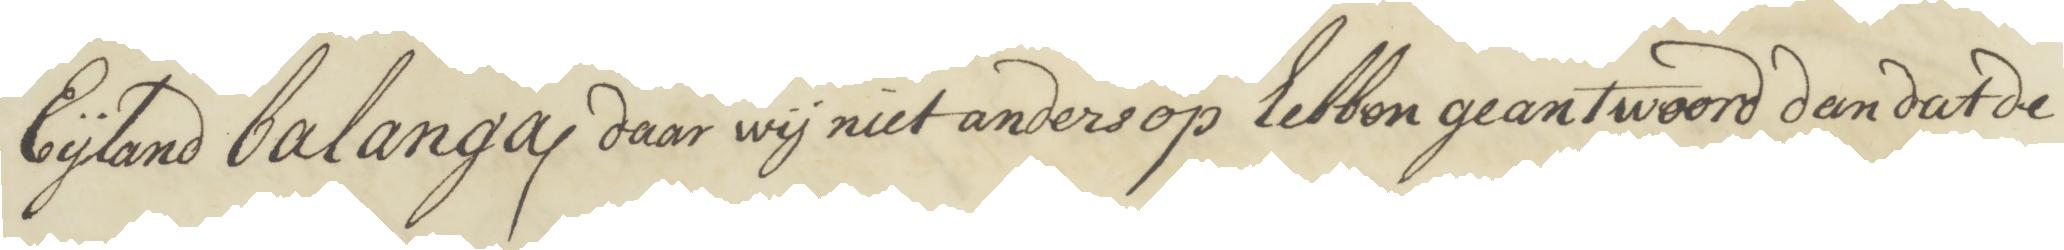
Eijland balanga, daar wij niet anders op hebben geantwoord dan dat de
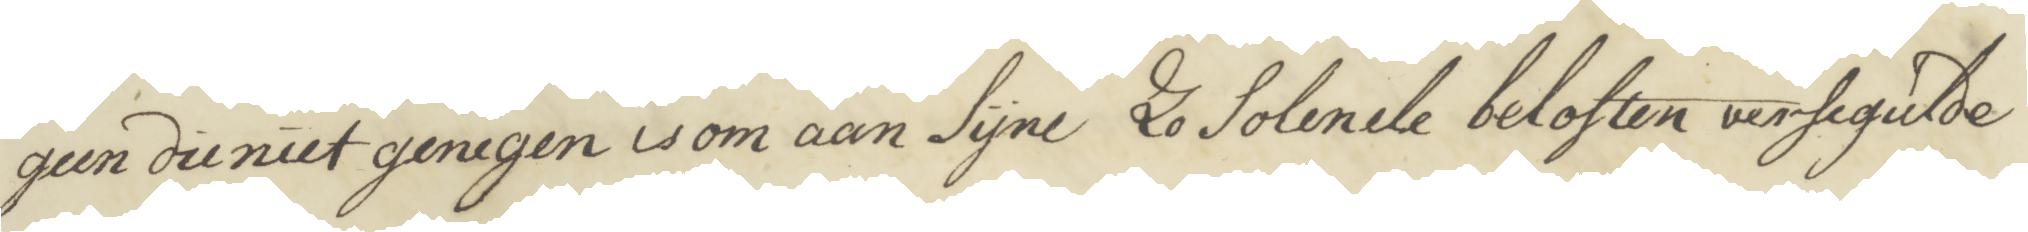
geen die niet genegen is om aan sijne zo solenele beloften versegulde
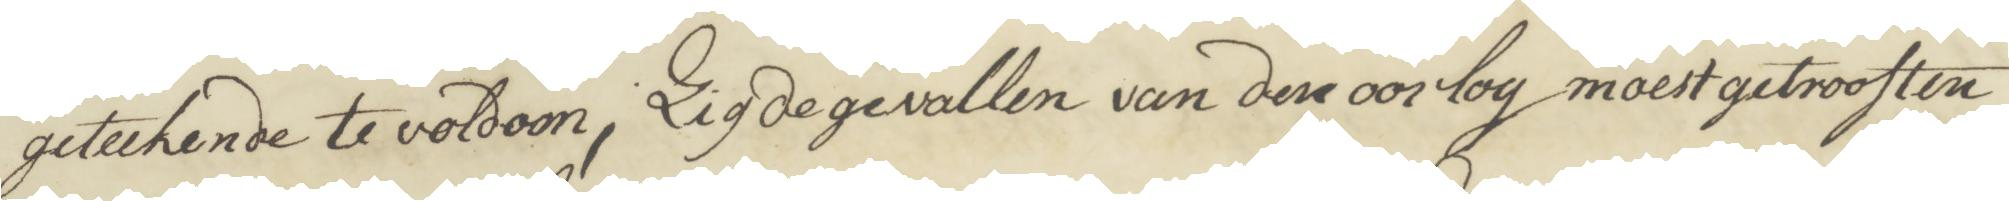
geteekende te voldoon, zig de gevallen van den oorlog moest getroosten
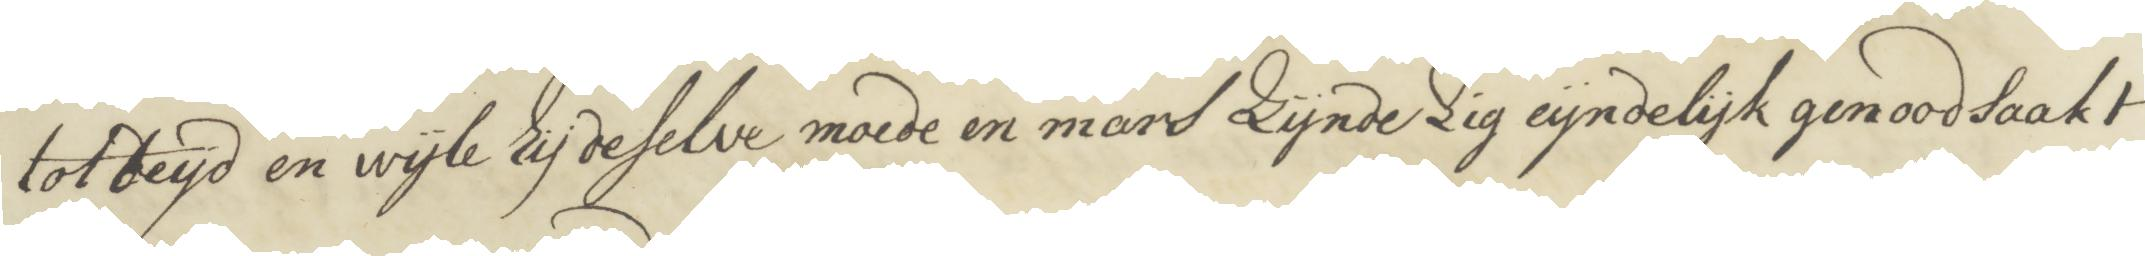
tot beijd en wijle hij deselve moede en mars zijnde zig eijndelijk genoodsaakt
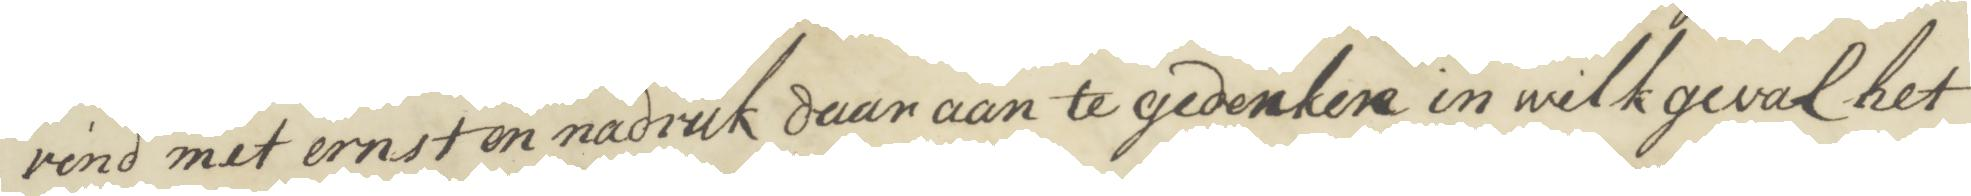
vind met ernst en nadruk daar aan te gedenken, in welk geval het
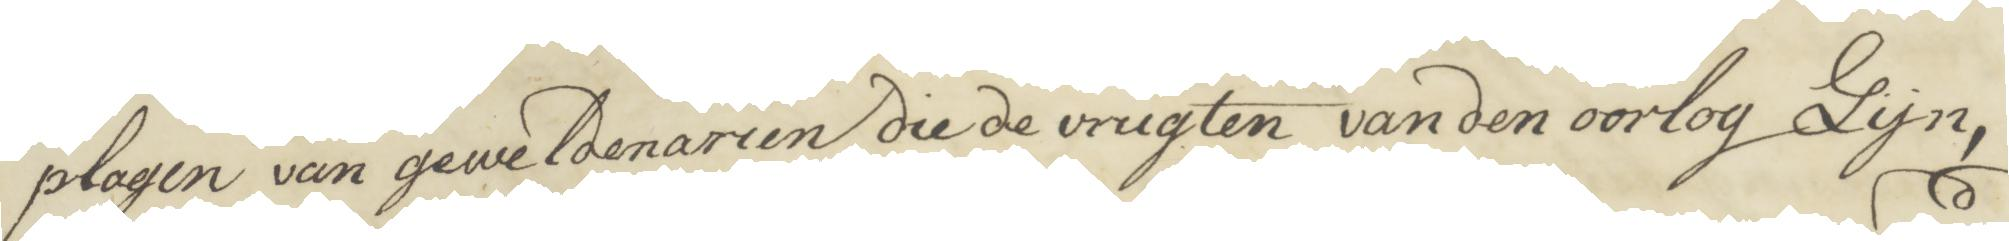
plagen van geweldenarien die de vrugten van den oorlog zijn,
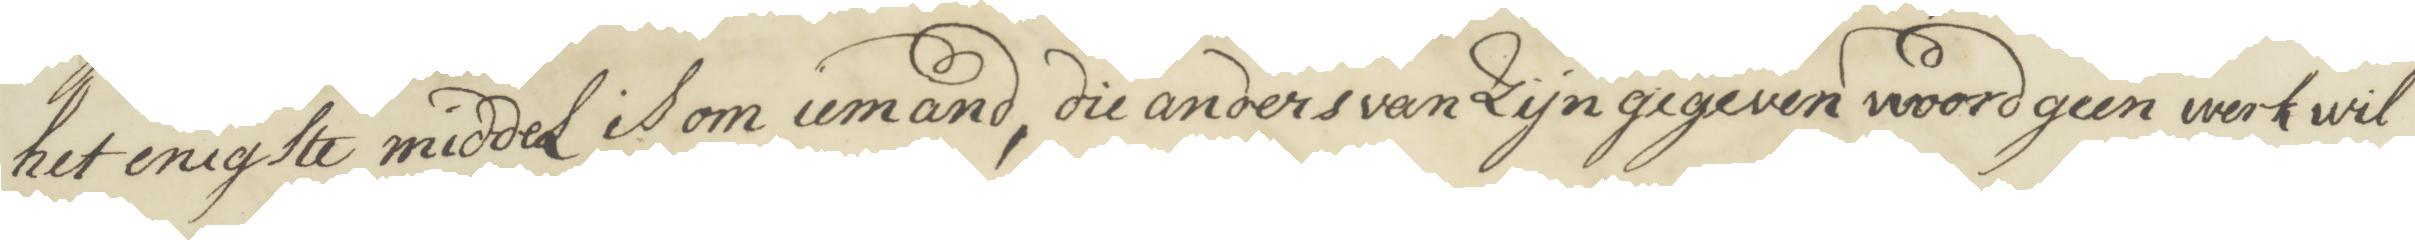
het enigste middel is om iemand, die anders van zijn gegeven woord geen werk wil
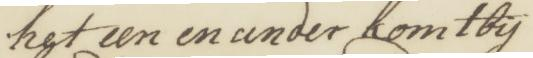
het een en ander komt bij
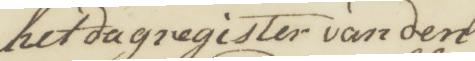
het dagregister van den
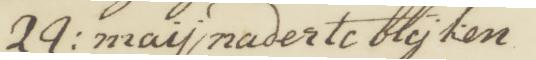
24: maij nader te blijken
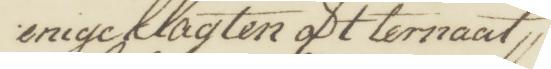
enige klagten over t ternaat„
